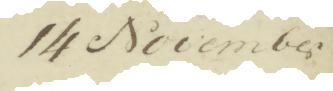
14 November
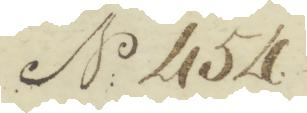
N:o 454.
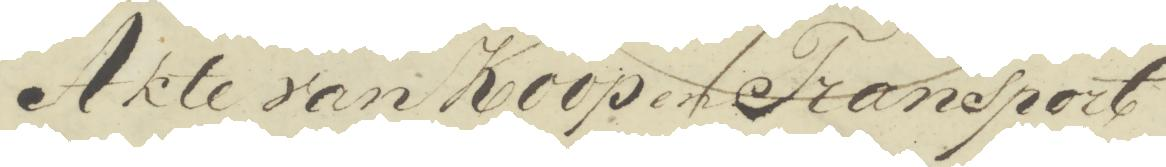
Akte van Koop en Transport
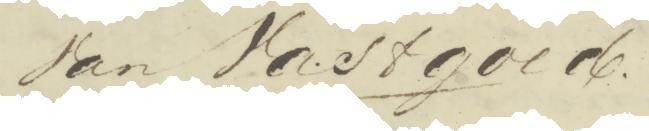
van Vastgoed.
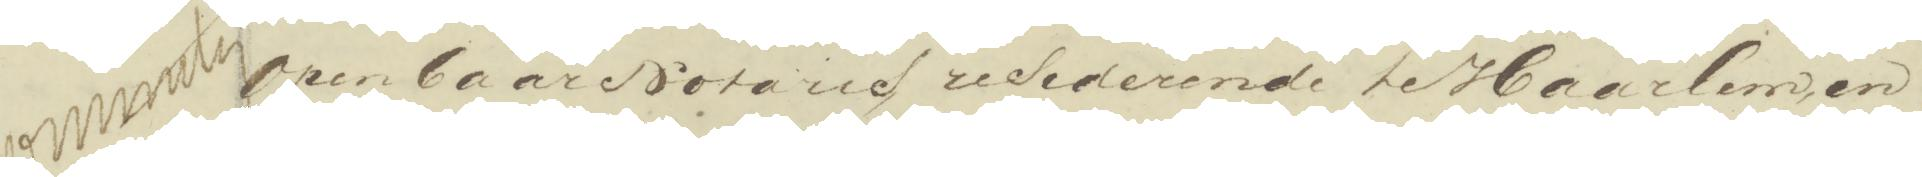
openbaar Notaris residerende te Haarlem, in
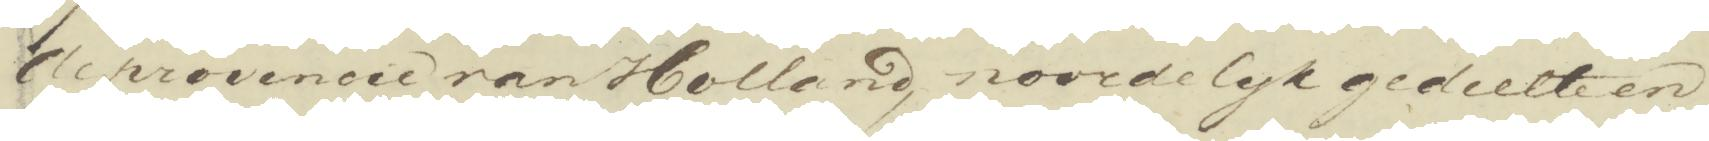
de provincie van Holland, noordelyk gedeelte en
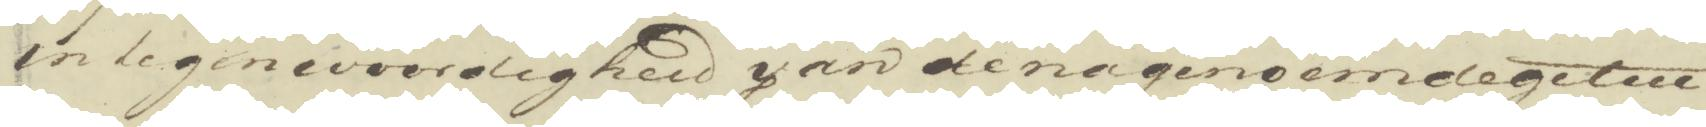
in tegenwoordigheid van de nagenoemde getui
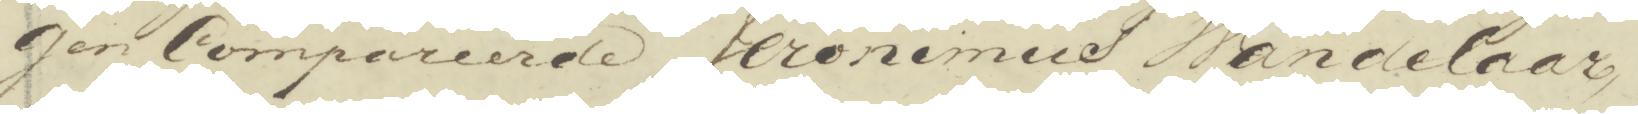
=gen Compareerde Jeronimus Wandelaar,
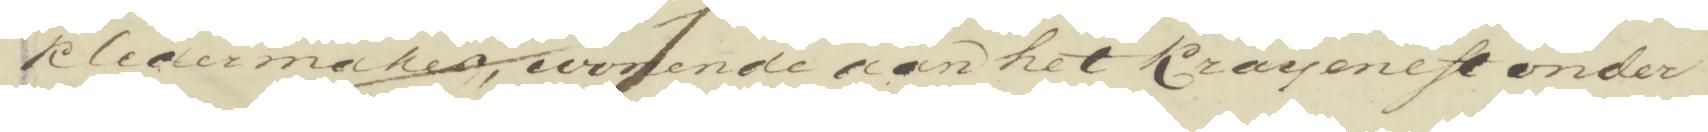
kledermaker, wonende aan het Krayenest onder
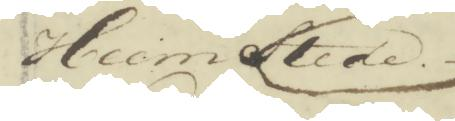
Heemstede.
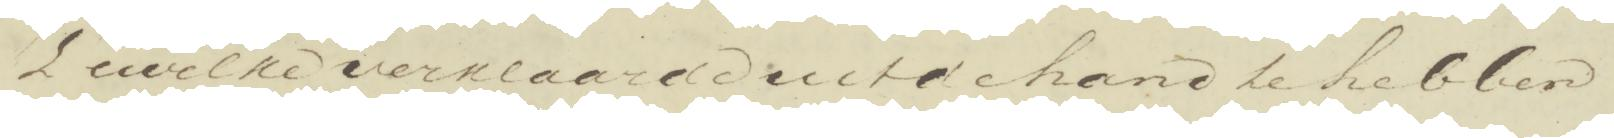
Dewelke verklaarde uitdehand te hebben
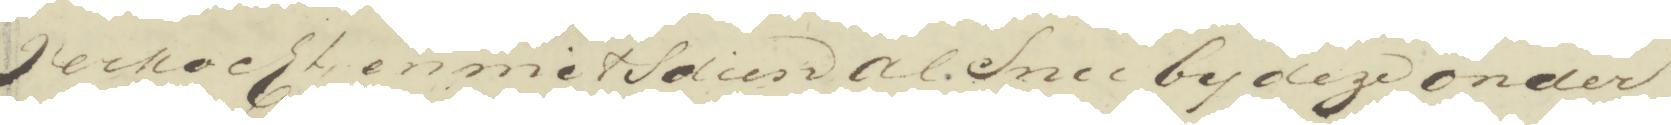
verkocht, en mitsdien alsnu by deze onder
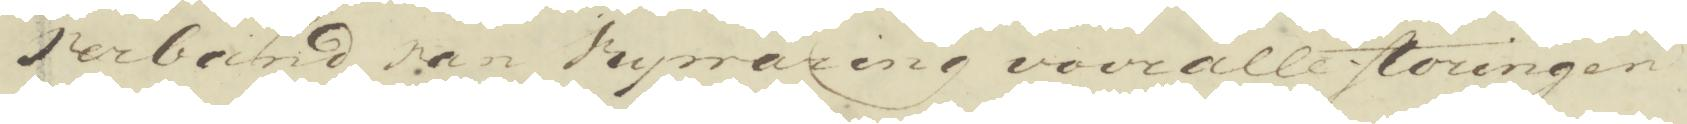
verband van vrywaring voor alle storingen
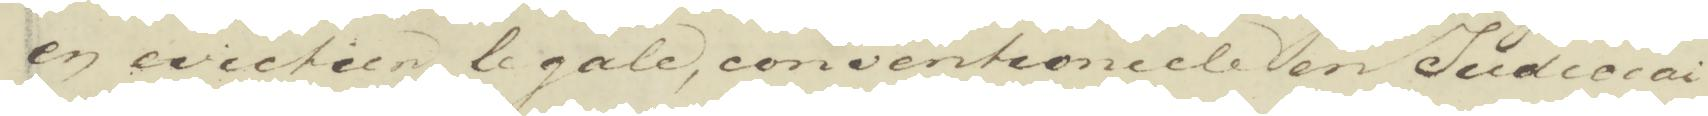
en evictien, legale, conventioneele en Judiciai
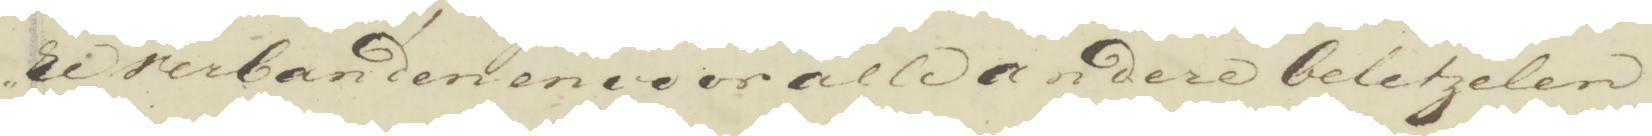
„re verbanden en voor alle andere beletzelen
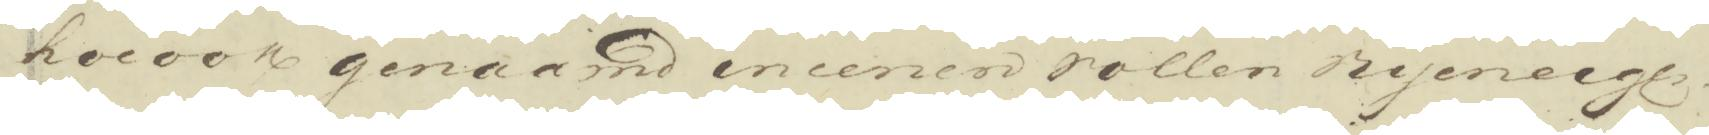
hoe ook genaamd in eenen vollen vryen eigen,
